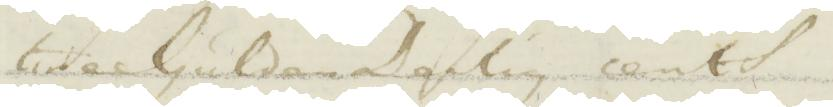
twee Gulden Dertig cents
